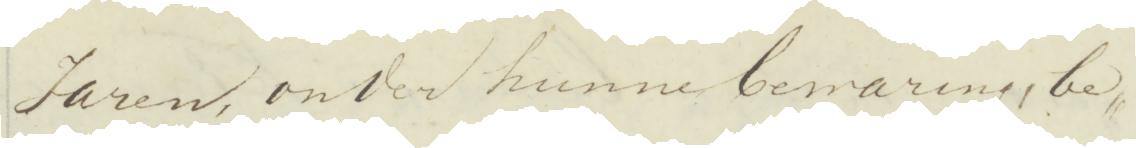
Iaren, onder hunne bewaring, be„
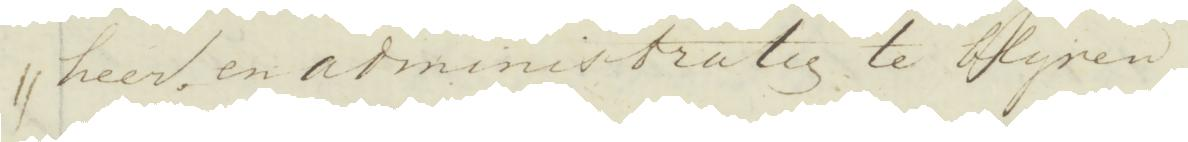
„heer, en administratie te blijven
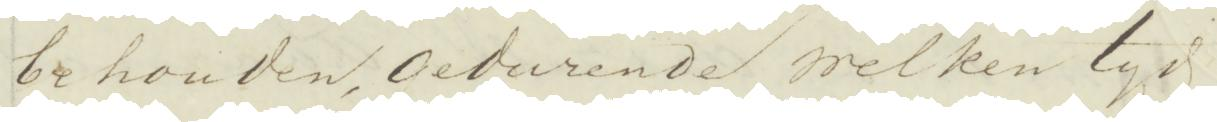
behouden, gedurende welken tijd
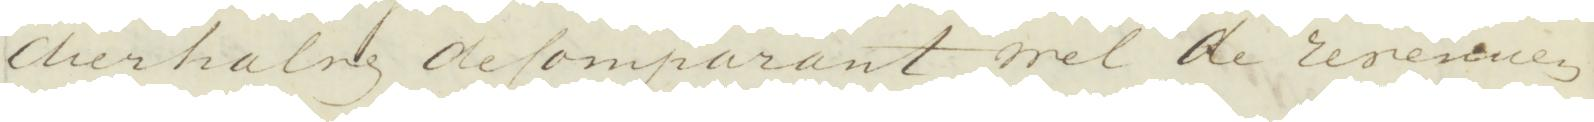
dierhalve de comparant wel de revenuen
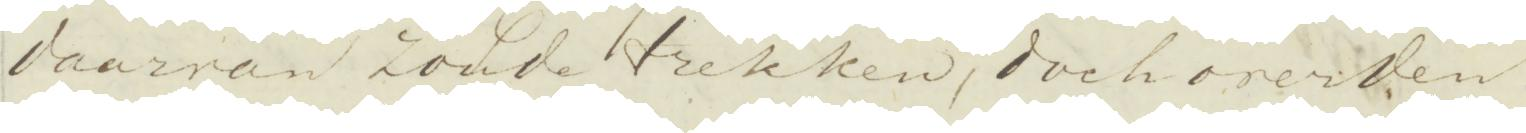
daarvan zoude trekken, doch over den
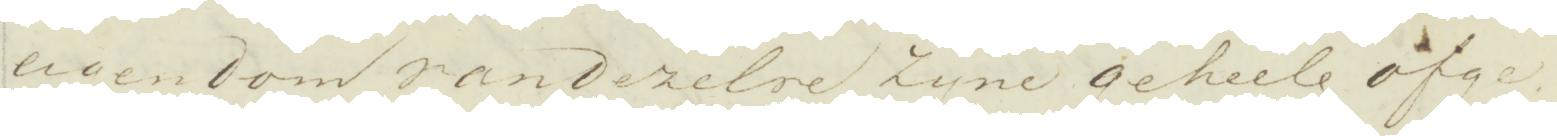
eigendom van dezelve zijne geheele of ge„
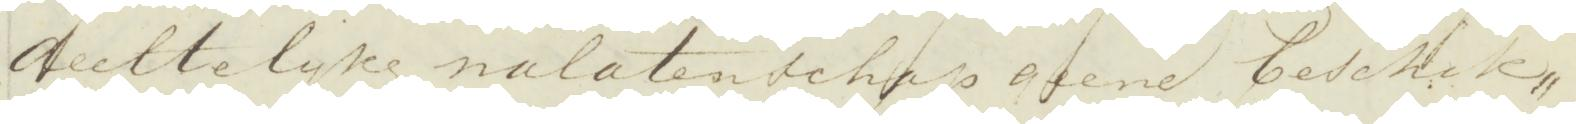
deeltelijke nalatenschap geene beschik„
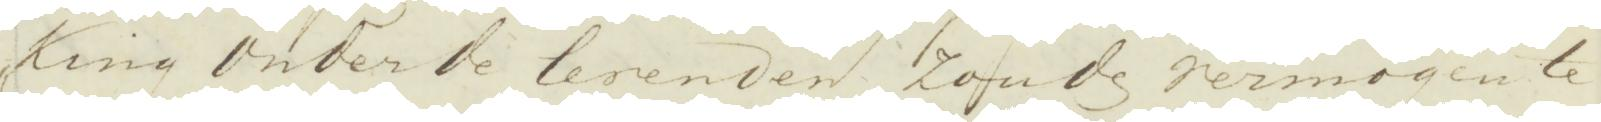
king onder de levenden zouden vermogen te
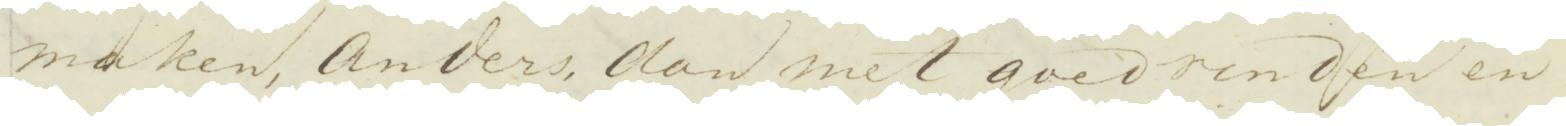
maken, Anders, dan met goedvinden en
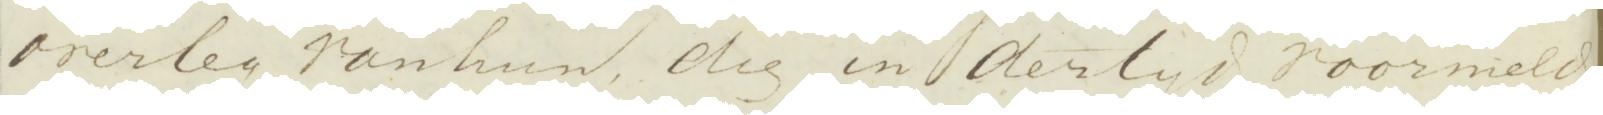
overleg van hun, die in der tijd voormeld
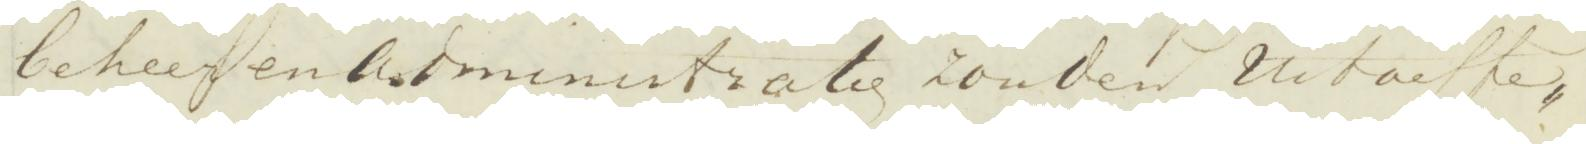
beheer en administratie zouden uitoeffe„
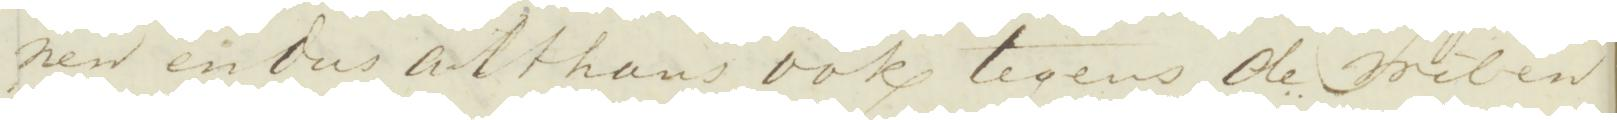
„nen en dus althans ook tegens de wil en
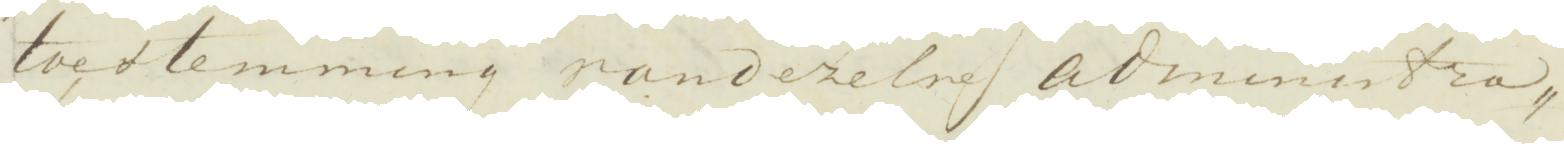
toestemming van dezelve administra„
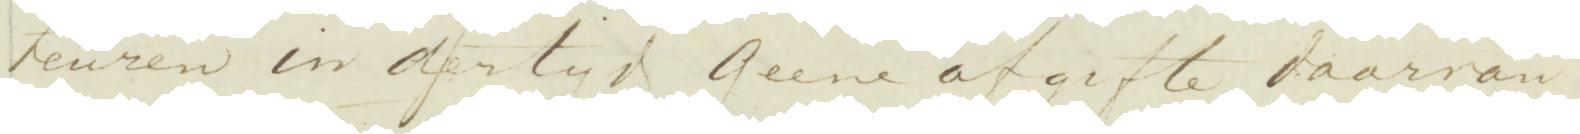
teuren in der tijd geene afgifte daarvan
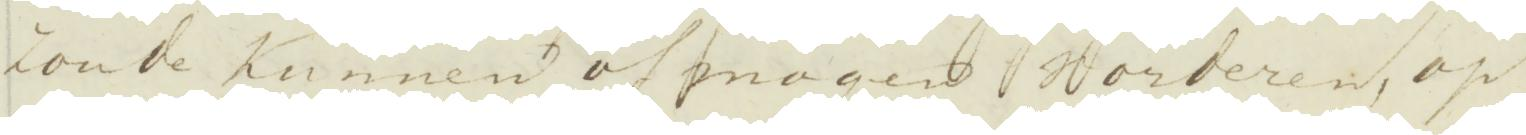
zoude kunnen of mogen vorderen, op
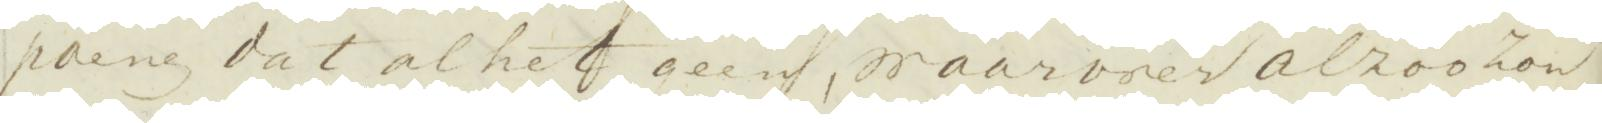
poene dat al het geen, waarover alzoo zon
